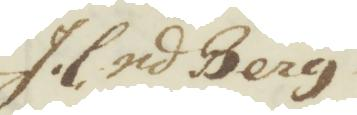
J.C. vd Berg
